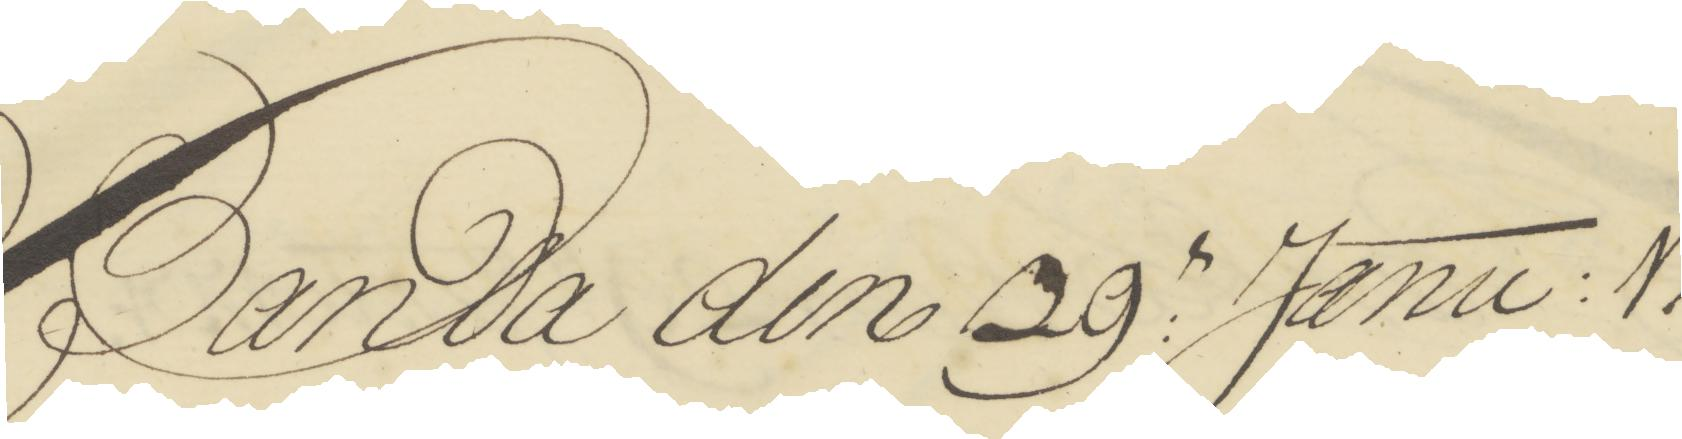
Banda den 29:en Janu: 1731
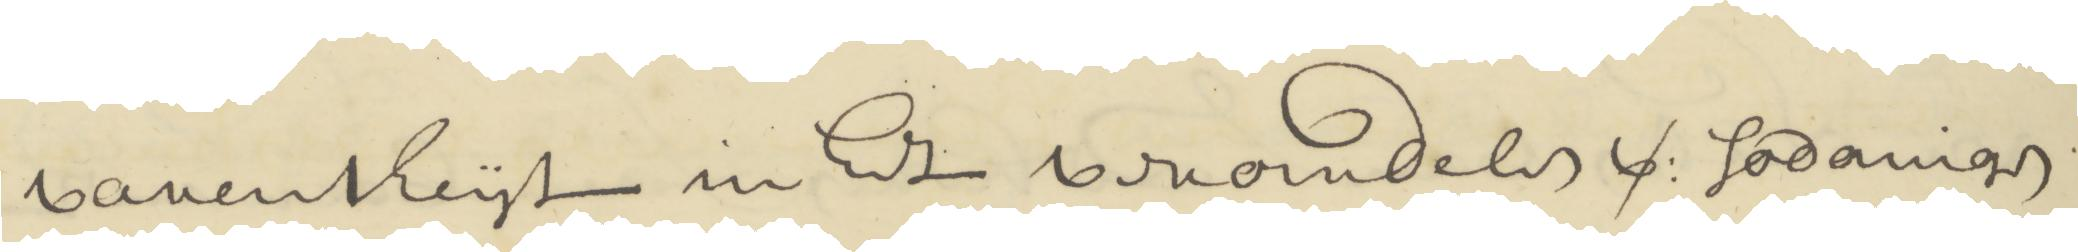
varentheijt in het verandelen van sodanigen
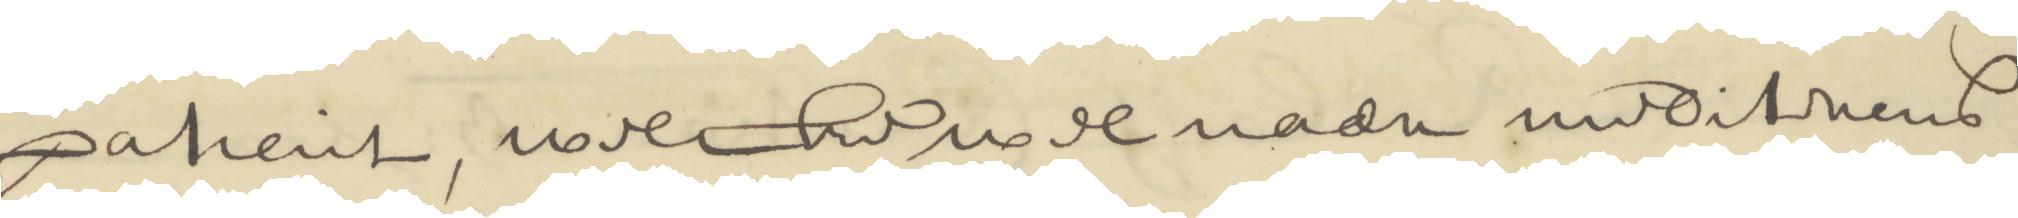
patent, welcke wel nader mediterens
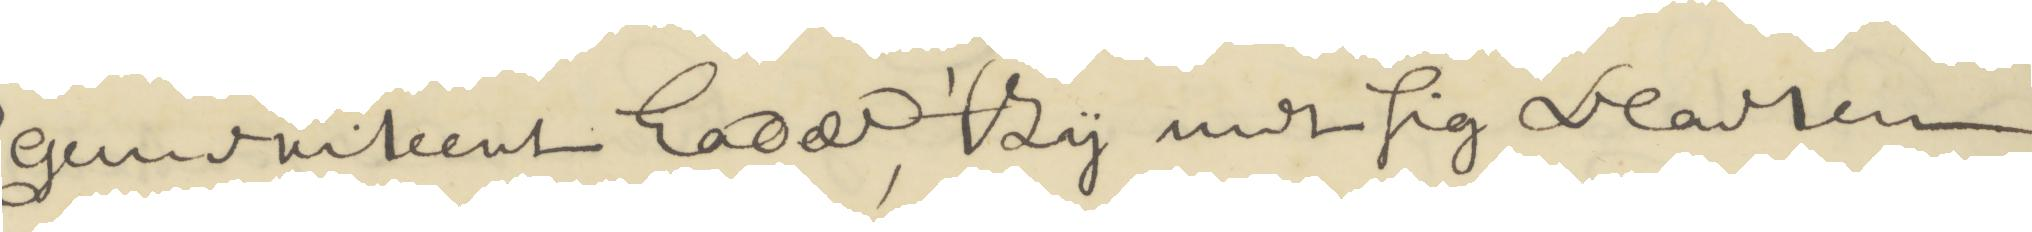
gemeriteert hadde, 't Zij met sig te laeten
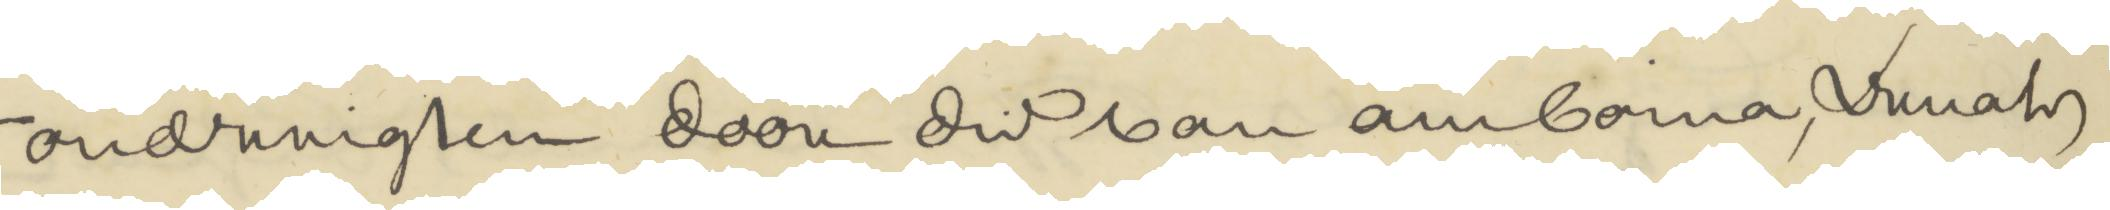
onderrigten door die van amboma, ternaten
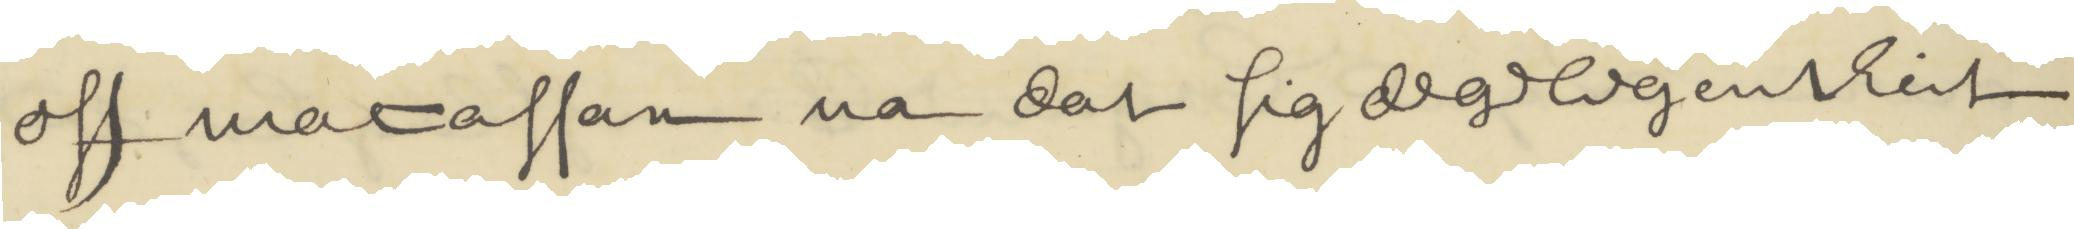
off macassar na dat sig de gelegentheit
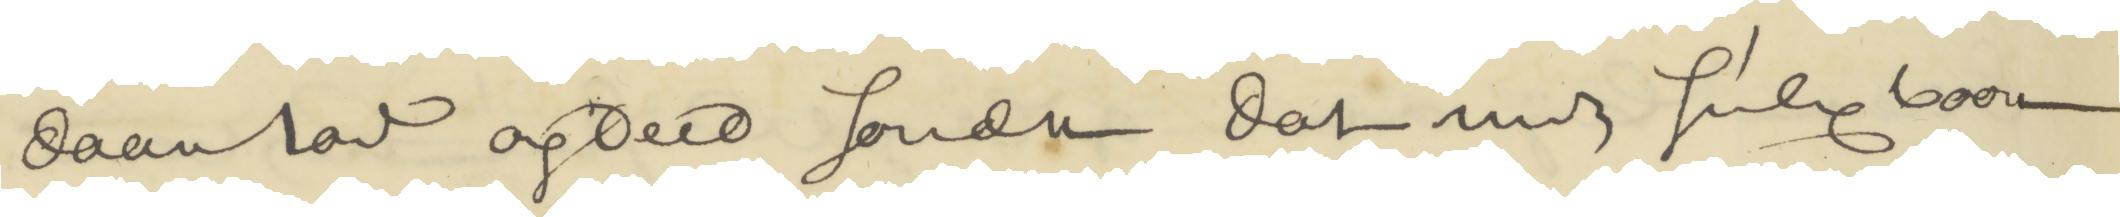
daar toe opdeed sonder dat men sulx voor
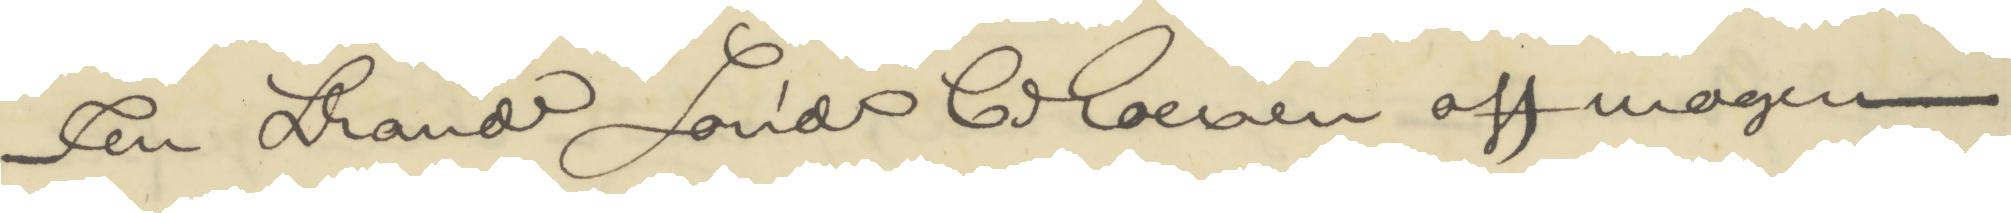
Een schande Soude behoeven off mogen
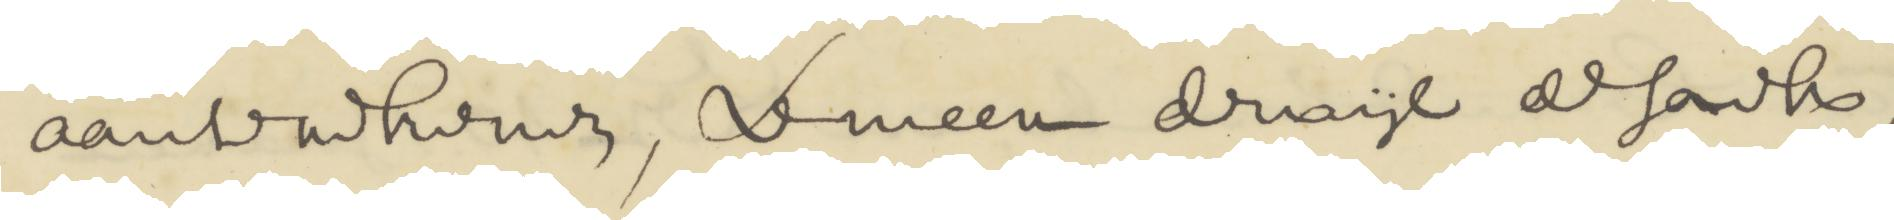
aan te rekenen, temeer dewijl de saek,
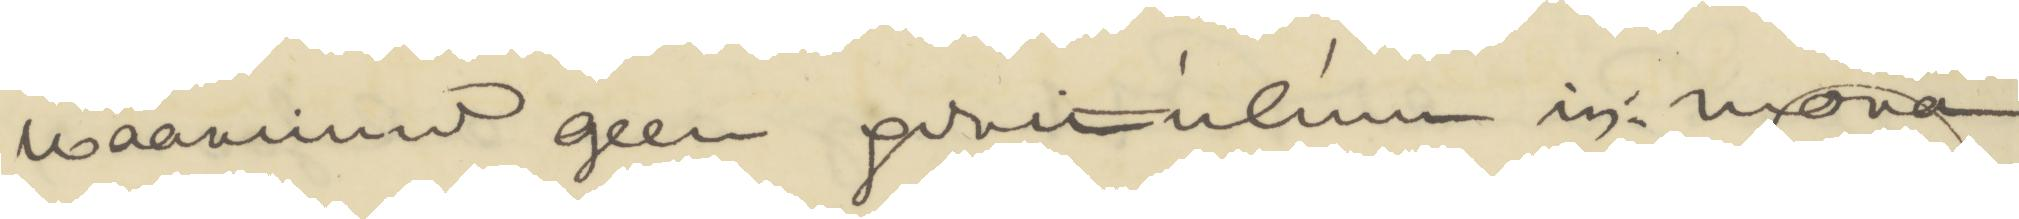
waarinne geen periculum in: mora
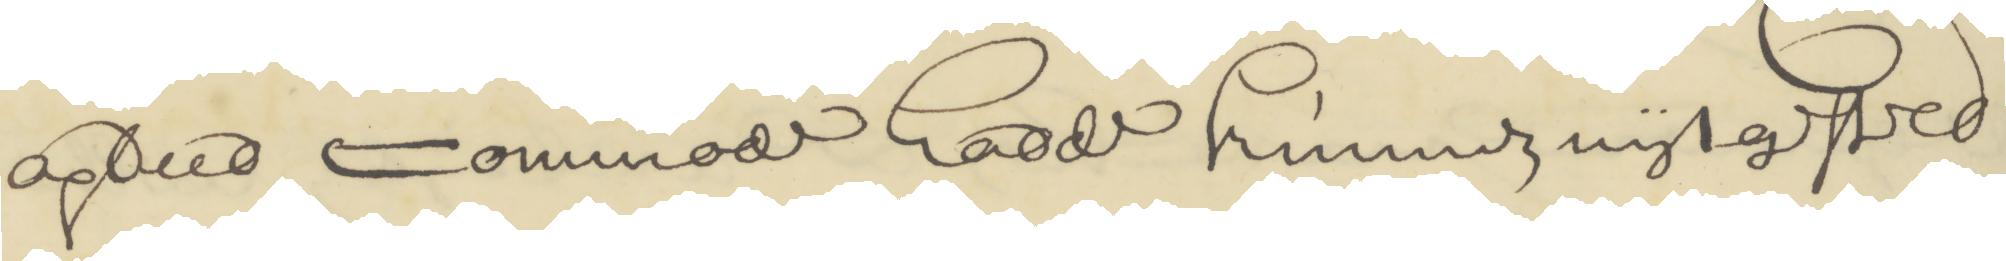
opdeed commode hadde kunnen uijt gesteld
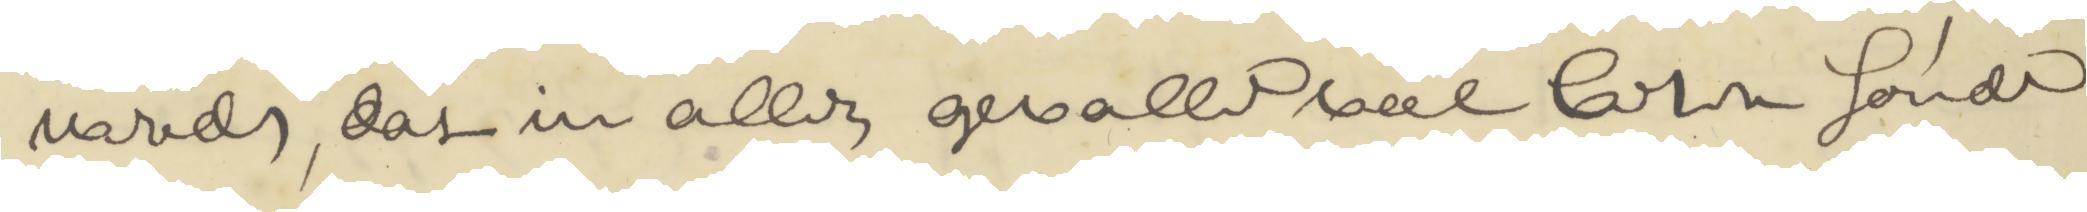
werden, dat in allen gevalle veel beter soude
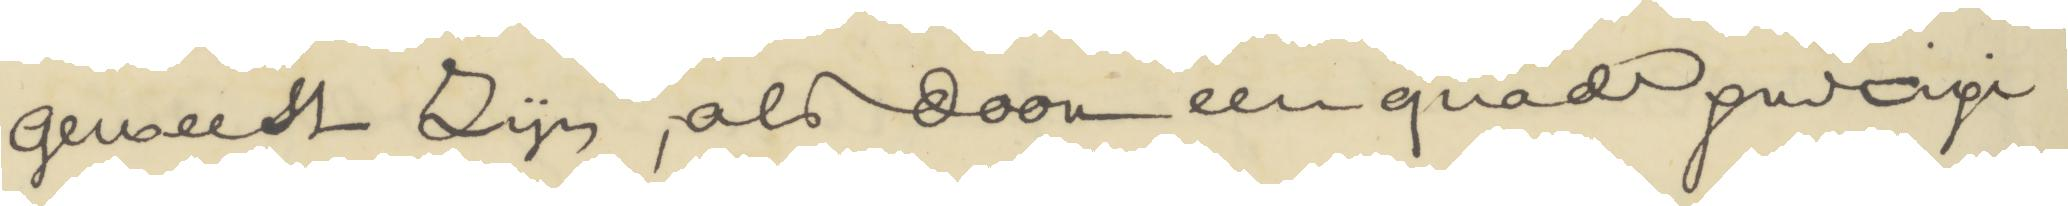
geweest Zijn, als door een quade precipi
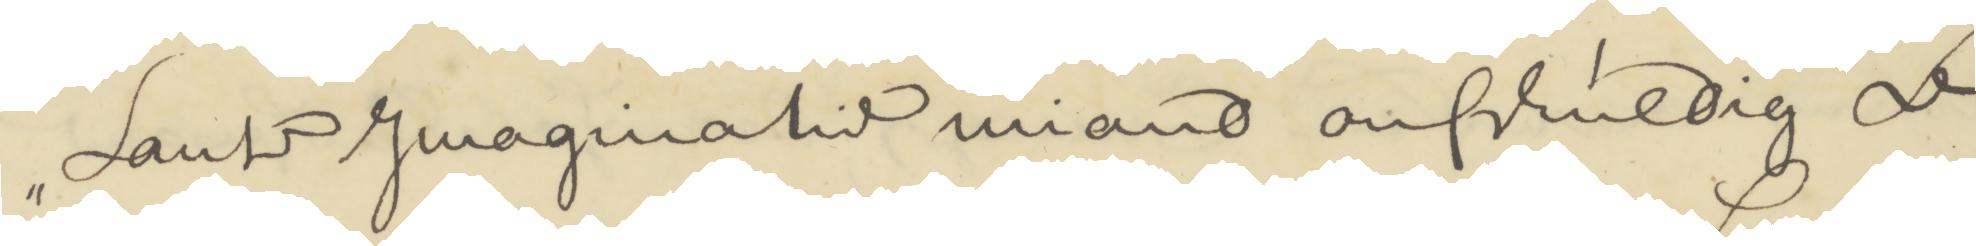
„tante Jmaginatie imand onschuldig te
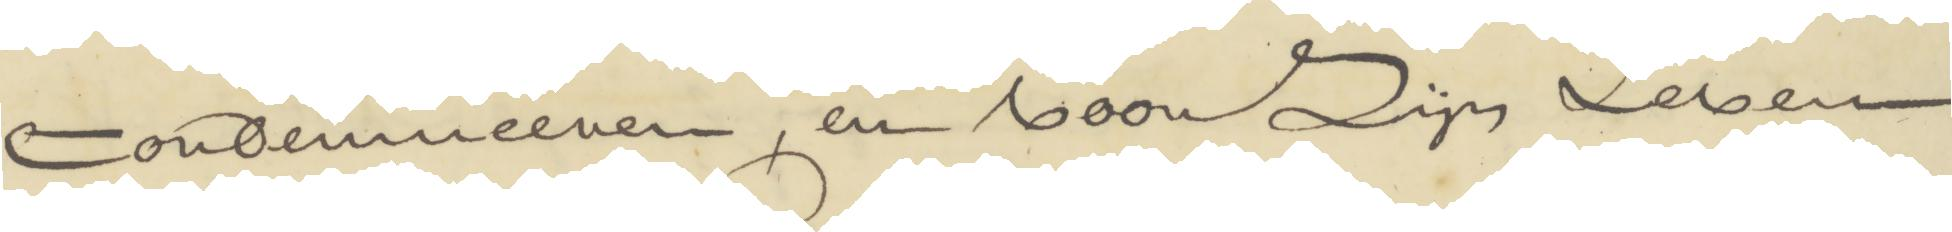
condemneeren, en voor Zijn Leven
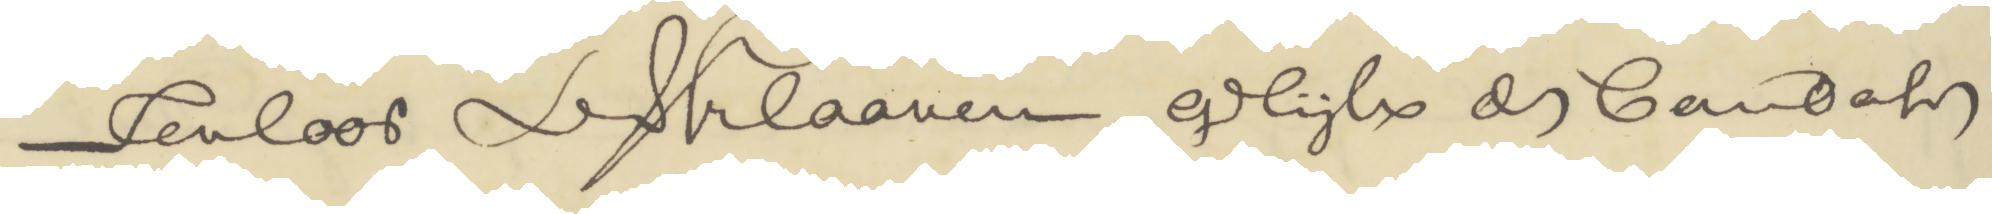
Eerloos teverklaaren, gelijk den bandasen
